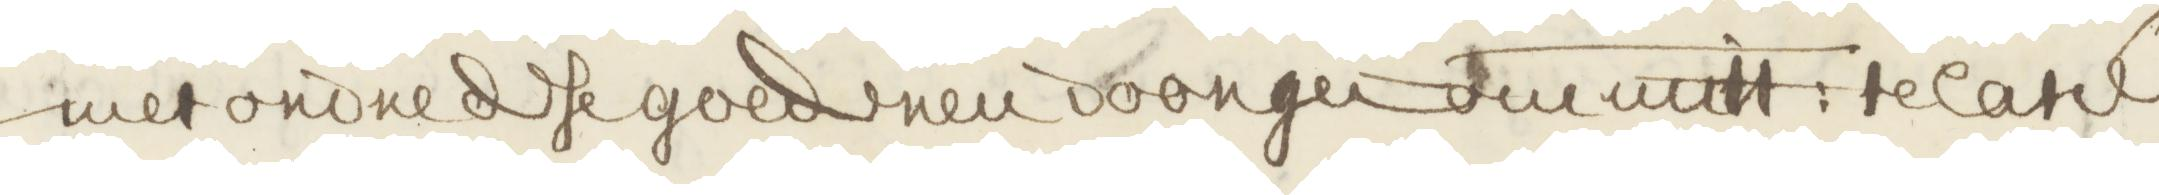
met ordre dese goederen door gecommitt: te late
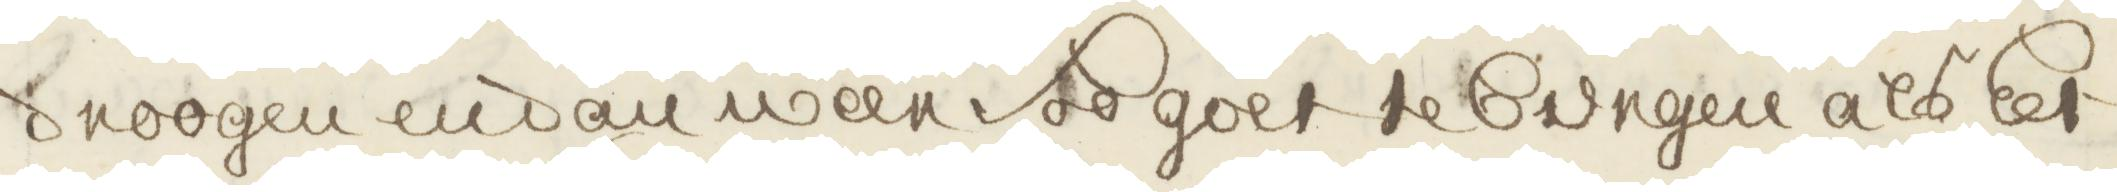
droogen en dan weer soo goet te bergen als het
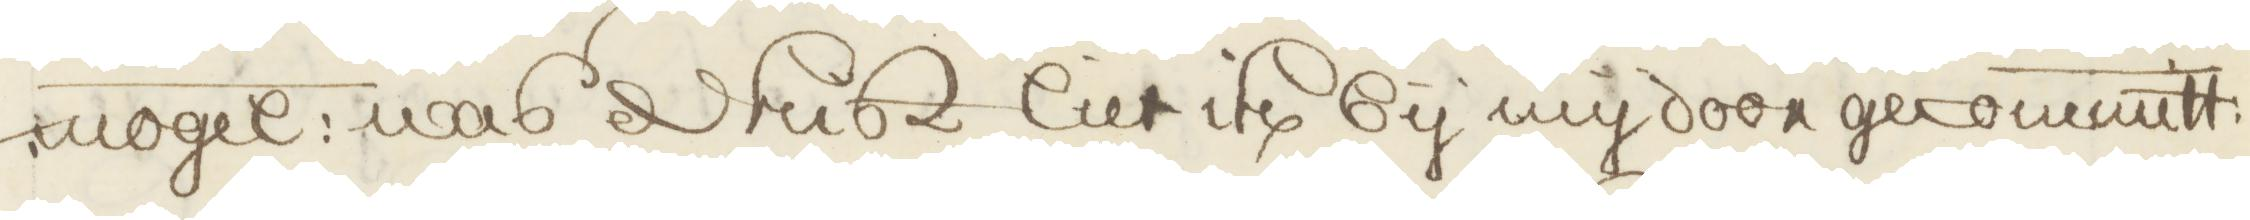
mogel: was de kist liet ik bij mij door gecommitt
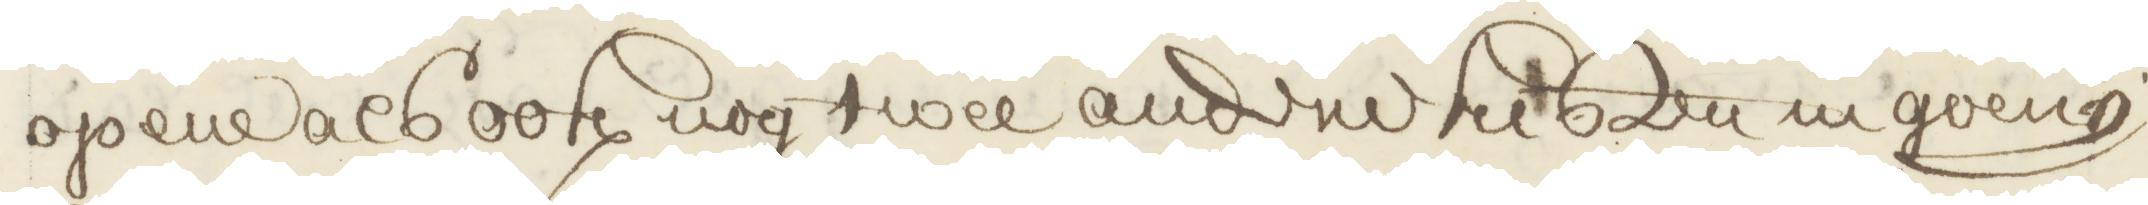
opene als ook nog twee andere kisten in goenij
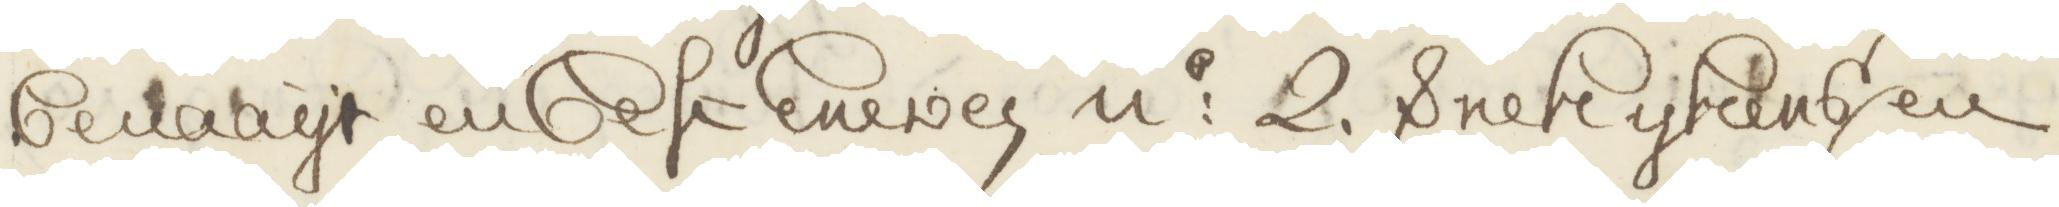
benaaijt en beschreven n:o 2. verrekijkers en
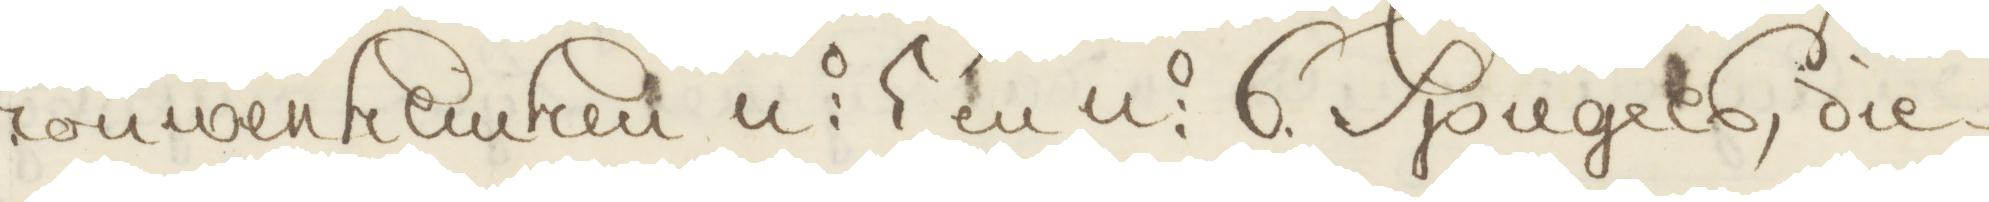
houwerklinken n:o 5 en n:o 6. spiegels, die
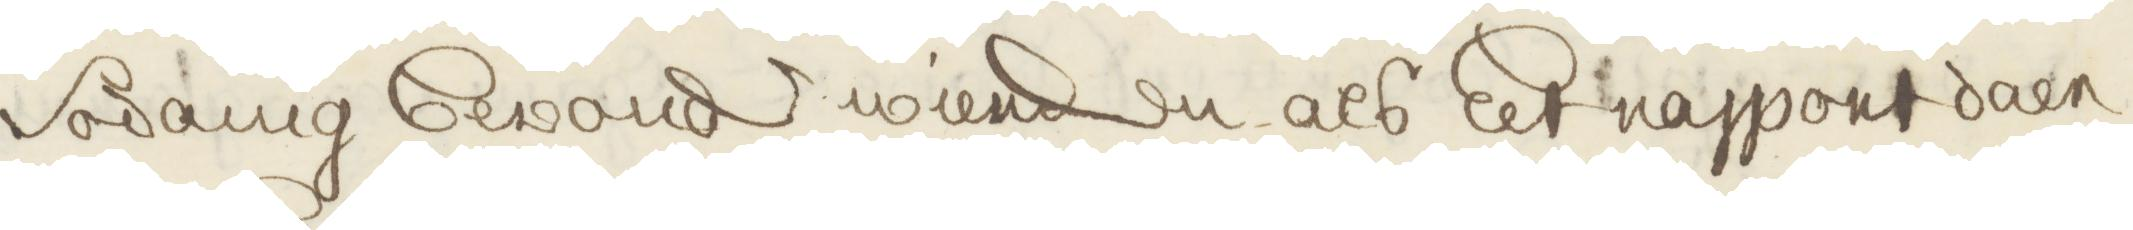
sodanig bevonde wierden als het rapport daer
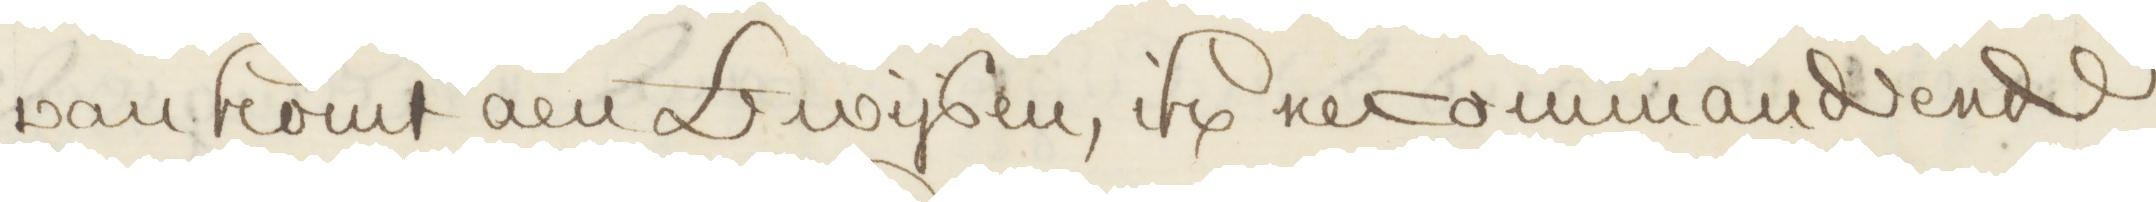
van komt aen te wijsen, ik recommandeerde
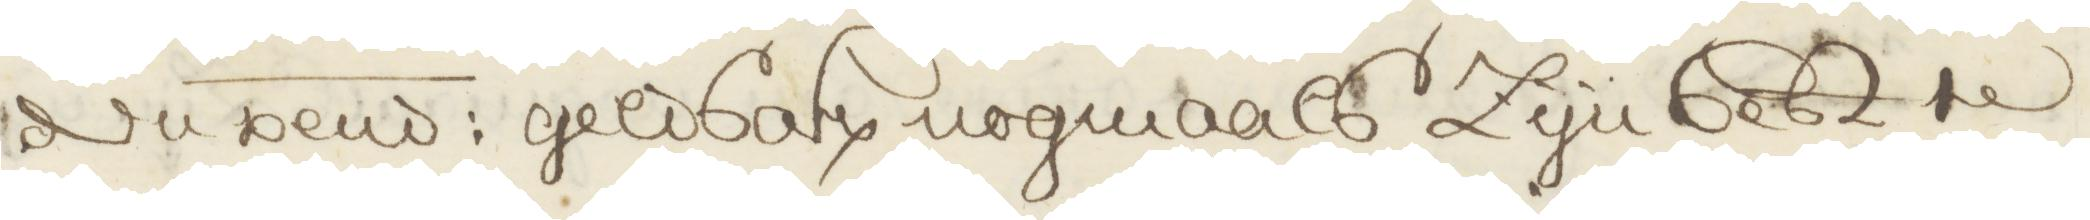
den vend: geldsak nogmaals zijn best te
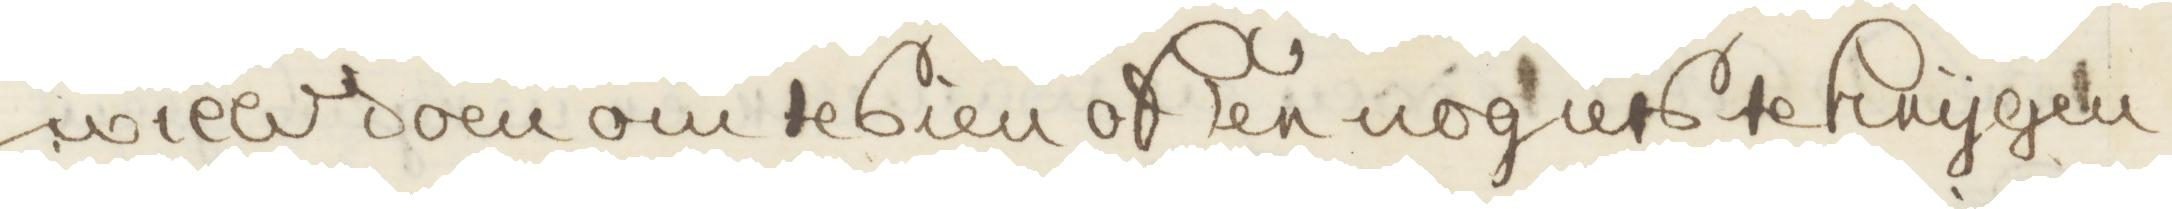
wille doen om te sien off er nog iets te krijgen
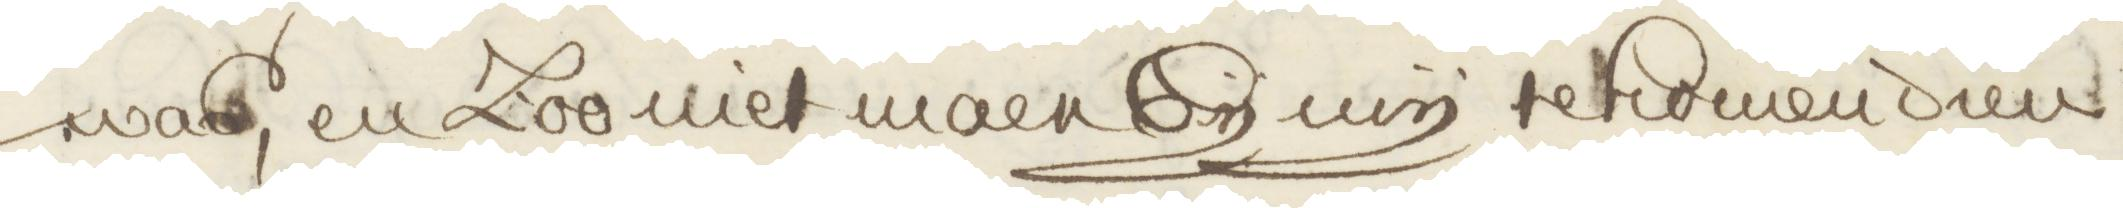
was, en zoo niet maer bij mij tekomen dien
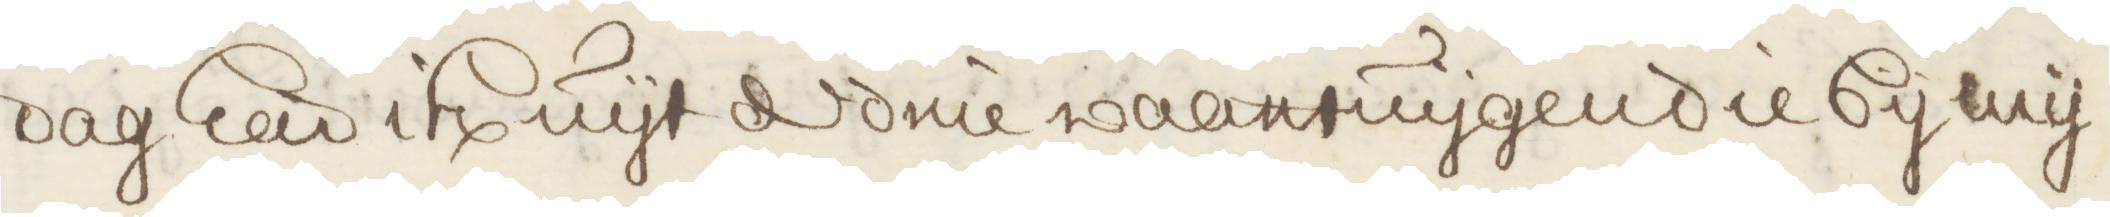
dag had ik uijt de drie vaartuijgen die bij mij
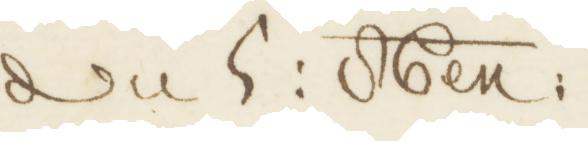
den 5:' 8ber:
